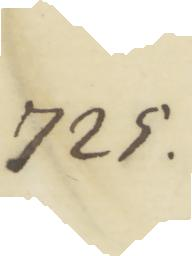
725.
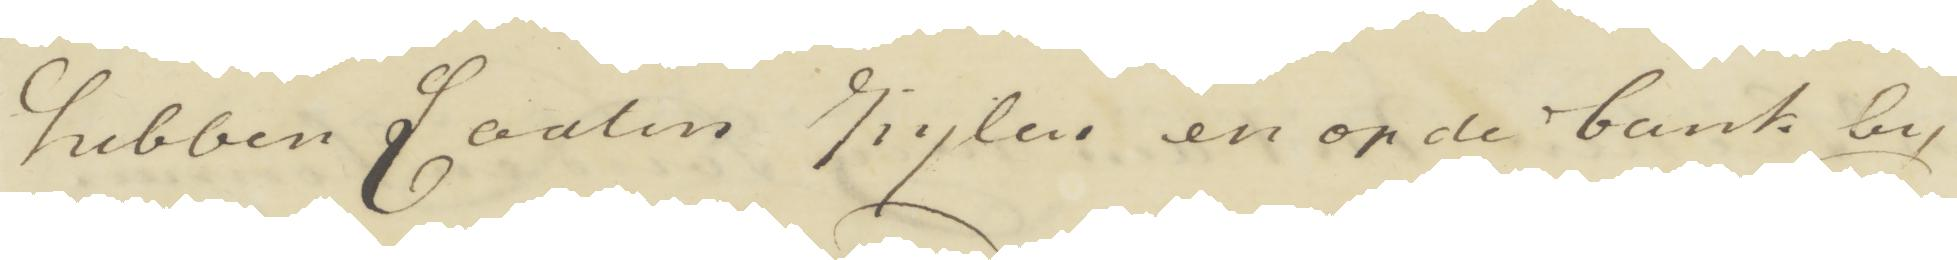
hebben Laaten pijlen en op de bank by
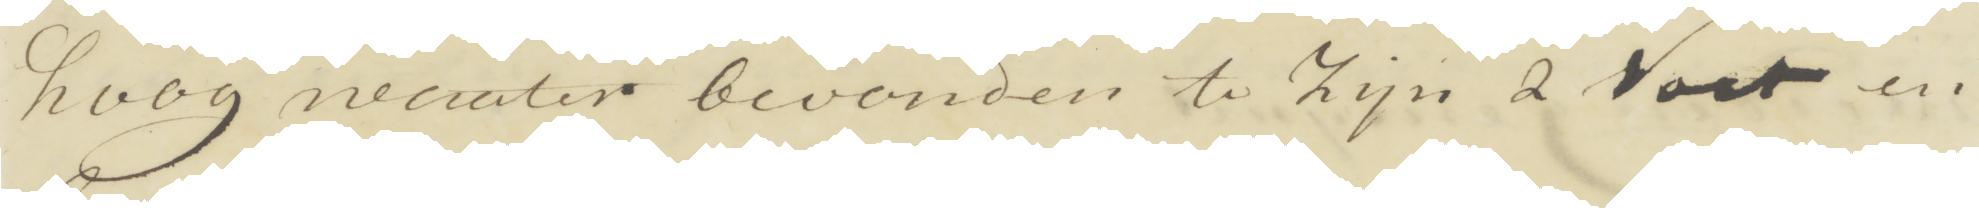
hoog waater bevonden te zijn 2 voet en
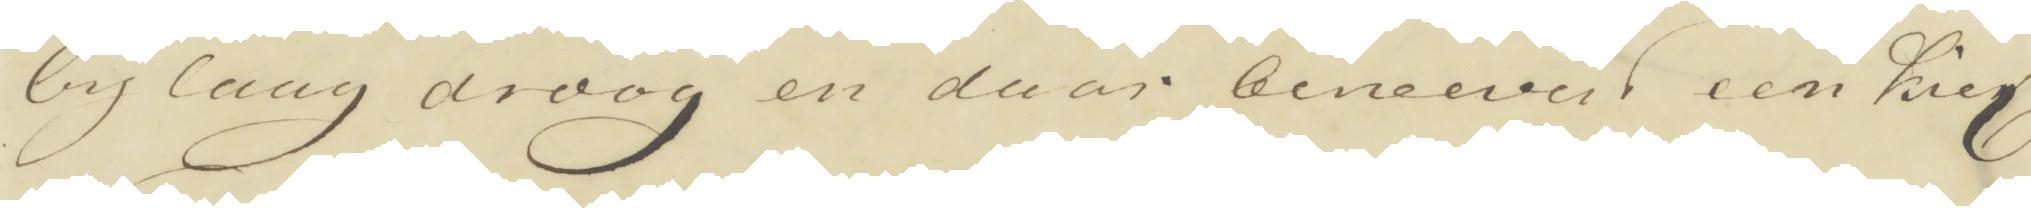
by laag droog en daar beneevens een kiel
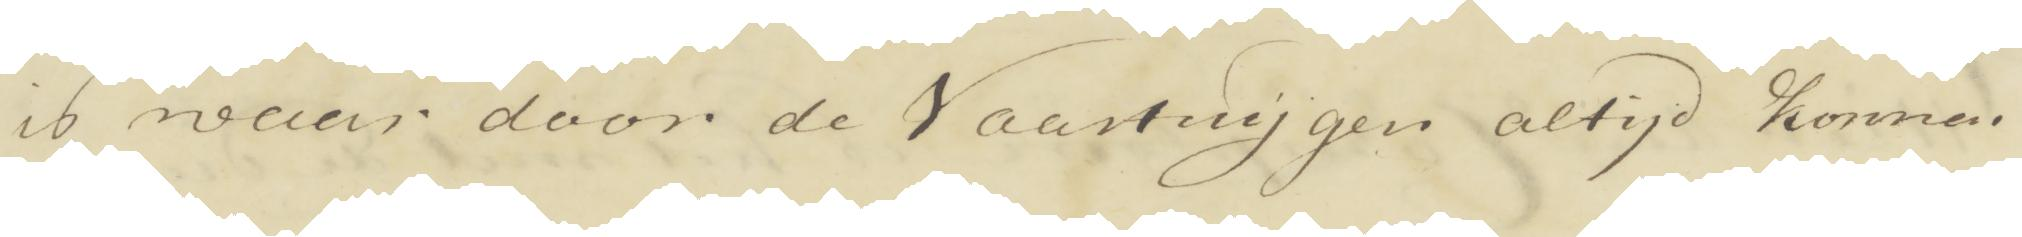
is waar door de vaartuijgen altijd konnen
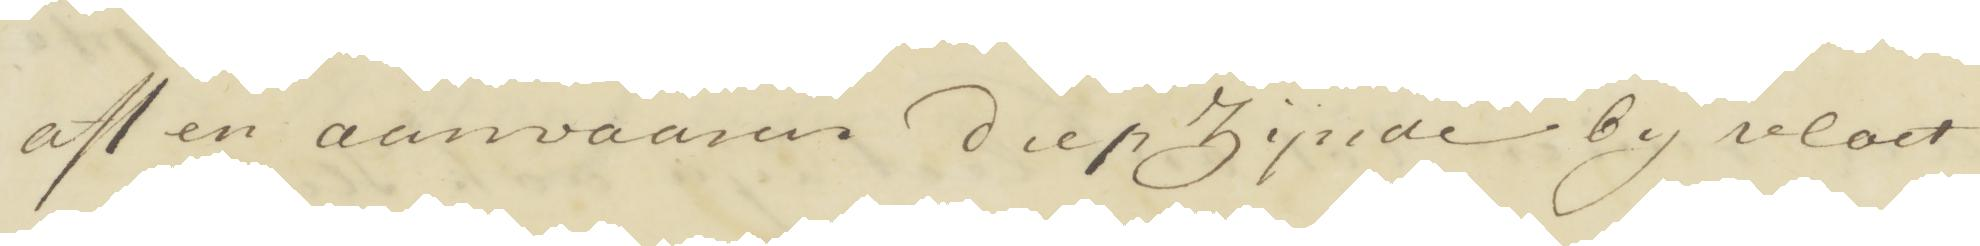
aff en aanvaaren diep zijnde by vloet
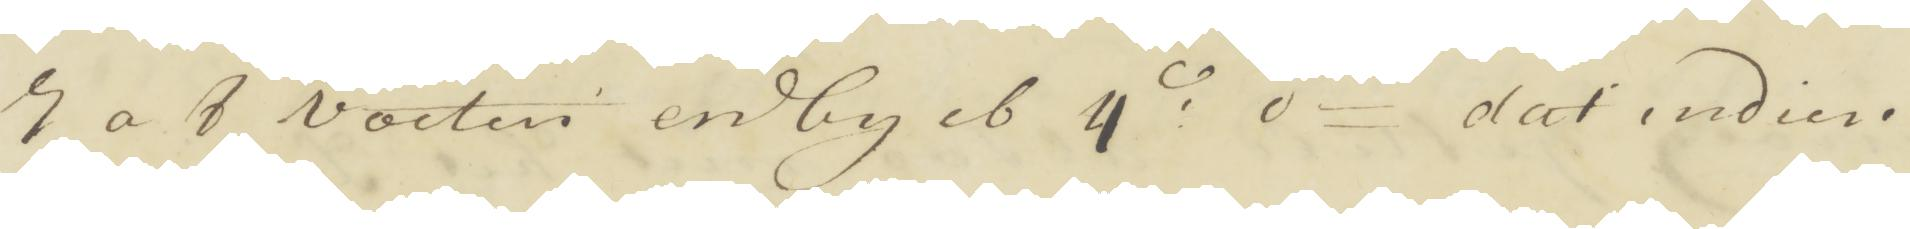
7 a 8 voeten en by eb 4: d=os dat indien
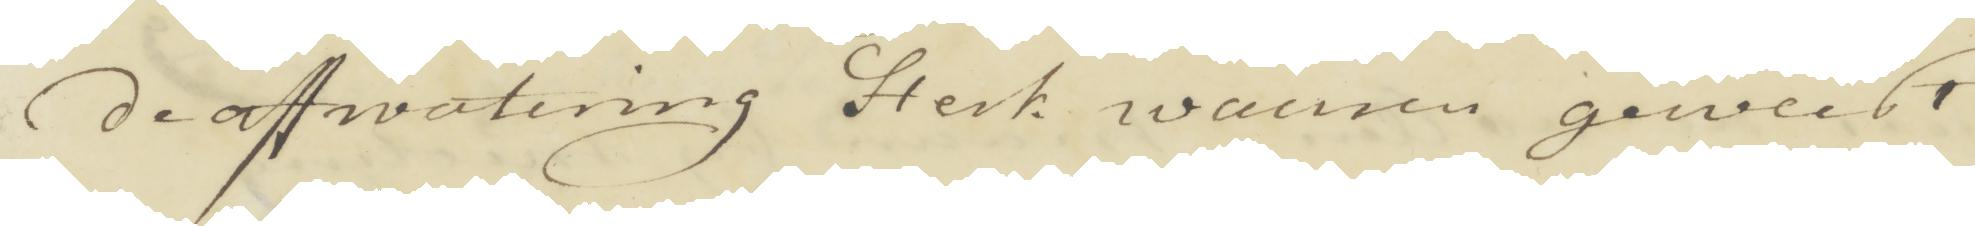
de affwatering sterk waaren geweest
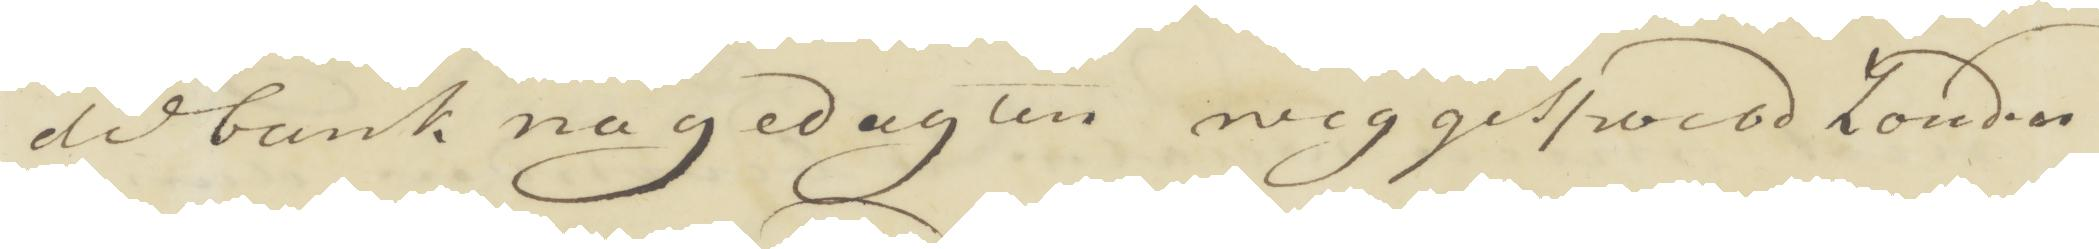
de bank na gedagten weggespoeld zouden
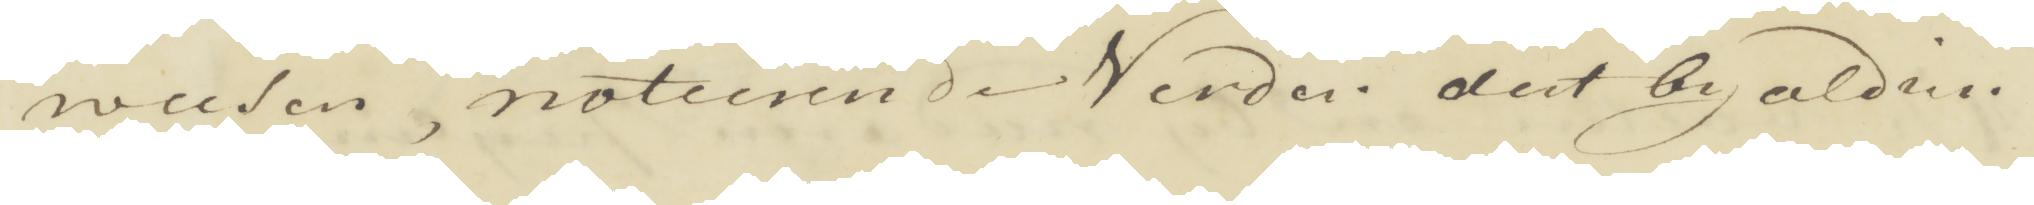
weesen, noteerende verder dat bij aldien
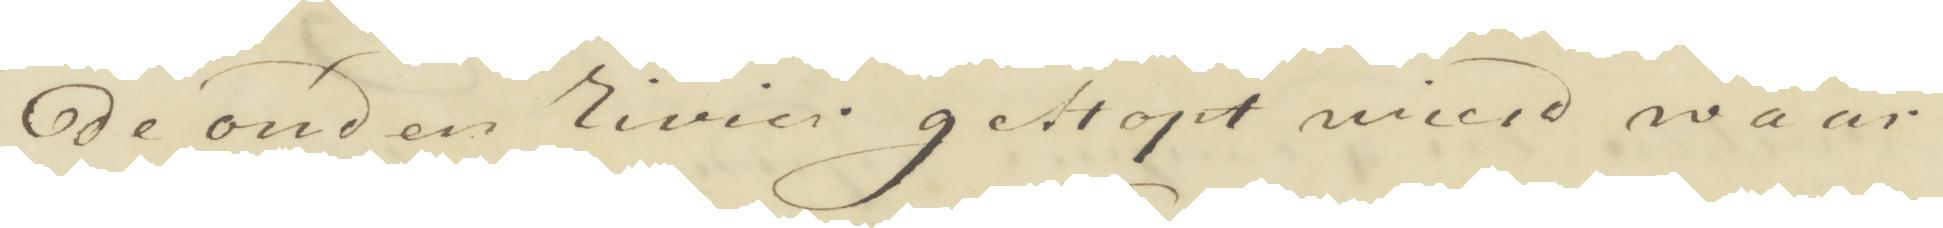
de ouden rivier gestopt wierd waar
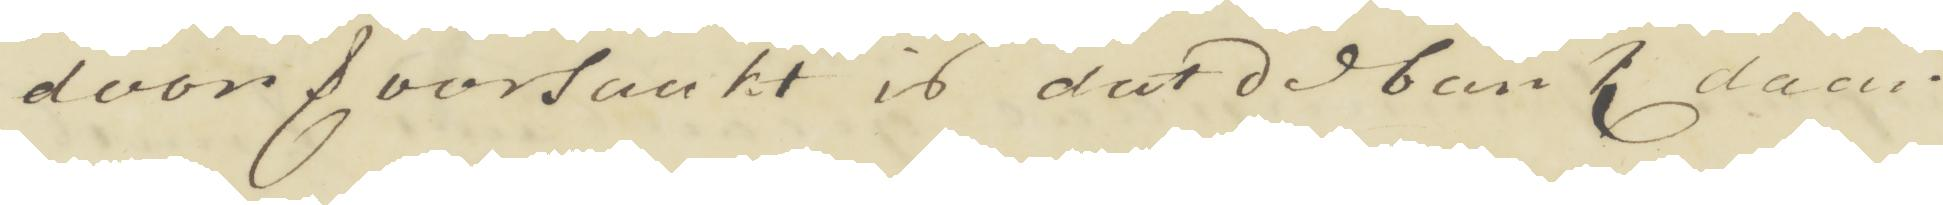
door veroorsaakt is dat de bank daar
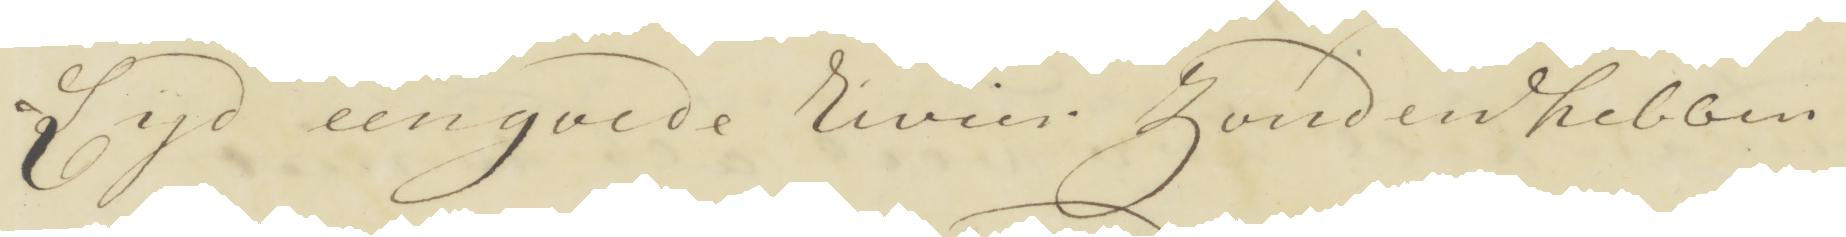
Lijd een goede rivier zouden hebben
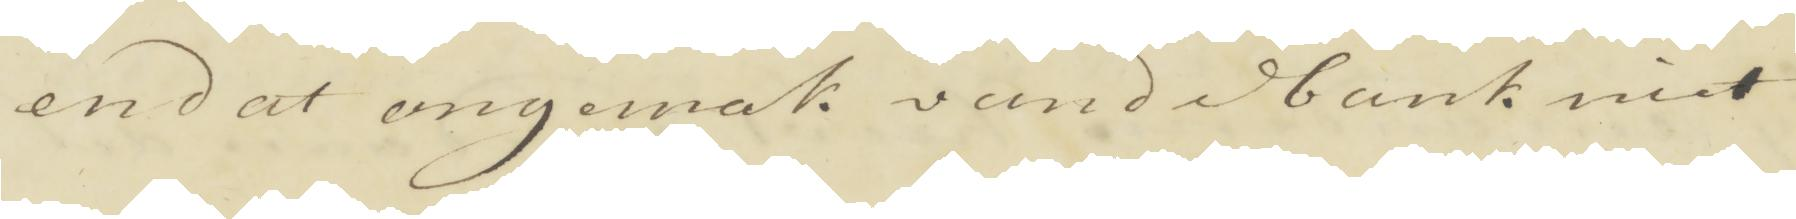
en dat ongemak van de bank niet
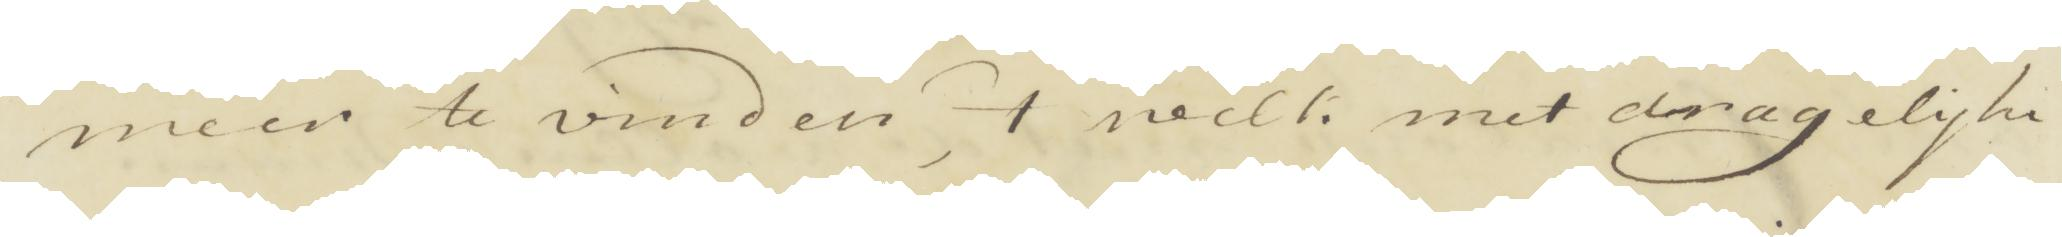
meer te vinden, 't welk met dragelijke
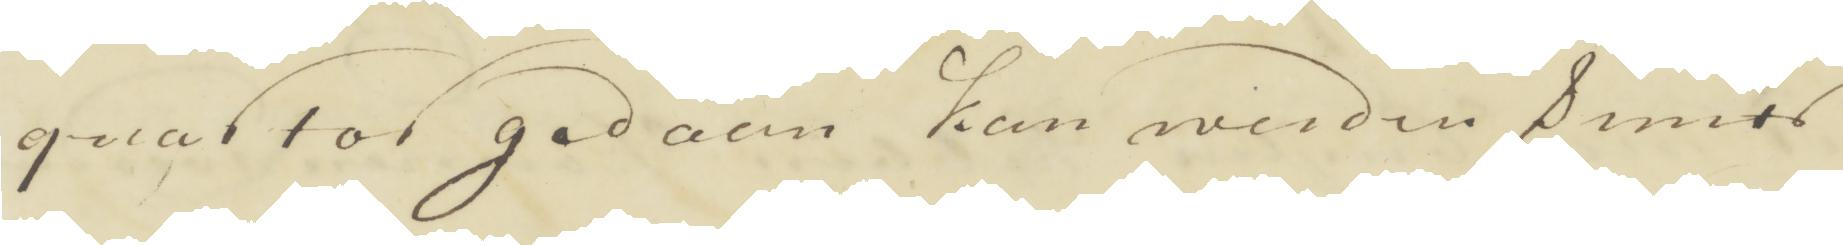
quastos gedaan kan werden vermits
